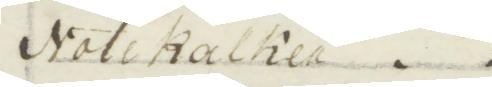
Notekalker
